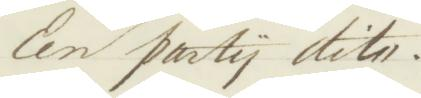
Een partij dito
